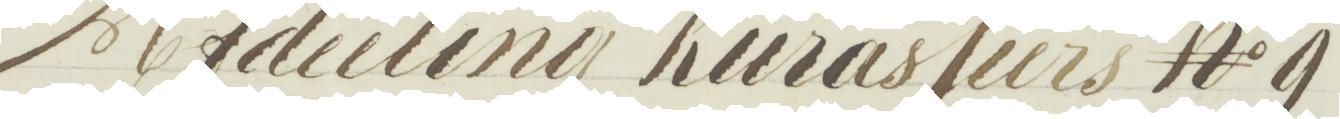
Afdeeling Kurassiers N=o 9
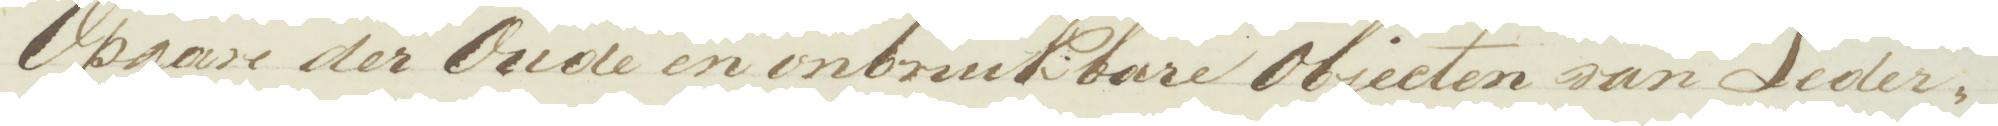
Opgave der Oude en onbruikbare Objecten van Leder„
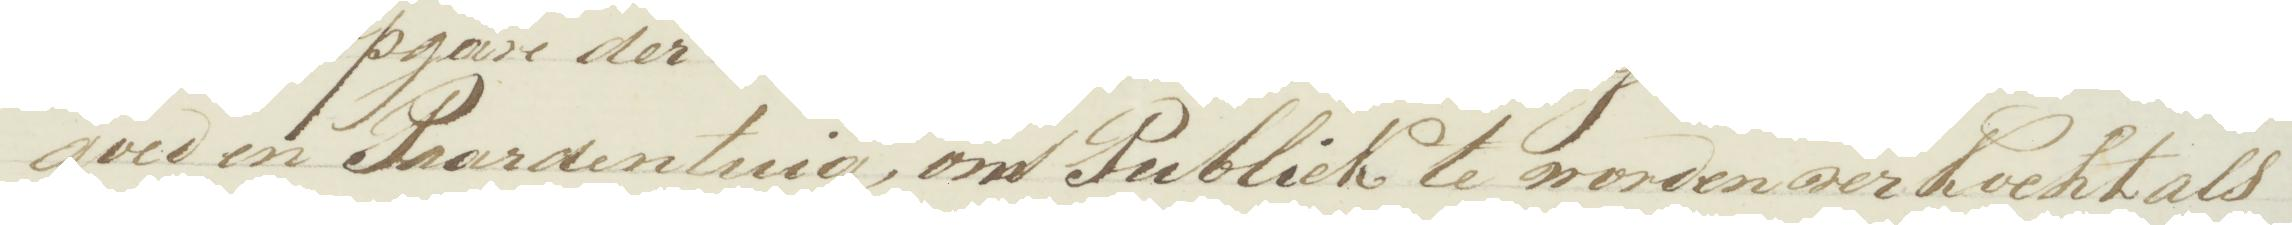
goed en Paardentuig, om Publiek te worden verkocht als
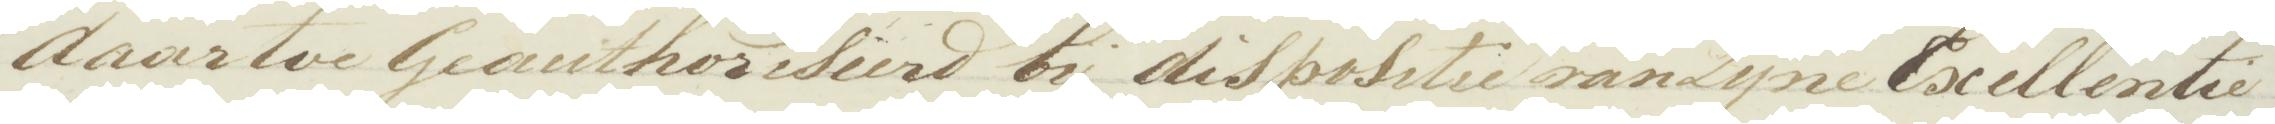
daartoe Geauthoriseerd bij dispositie van zijne Excellentie
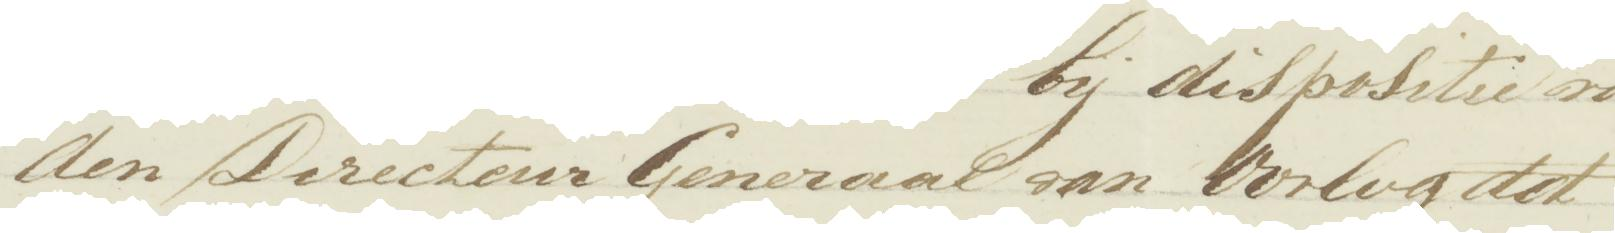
den Directeur Generaal van Oorlog dd
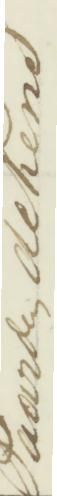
Paarden dekens
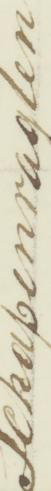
Schapenragten
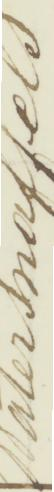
Watersnaffels
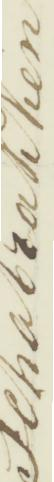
Schabrakken
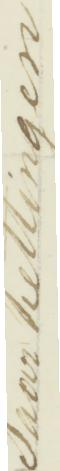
Paar Kettingen
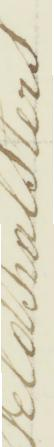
Veldhalsters
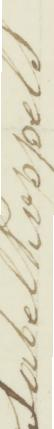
Sabelkoppels
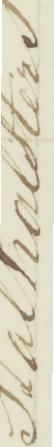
Stalhalsters
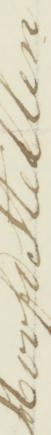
Hoofdstellen
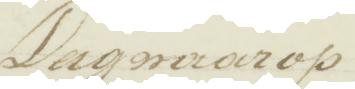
Dag waarop
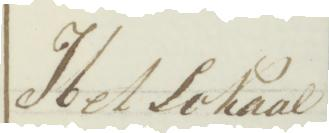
Het Lokaal
